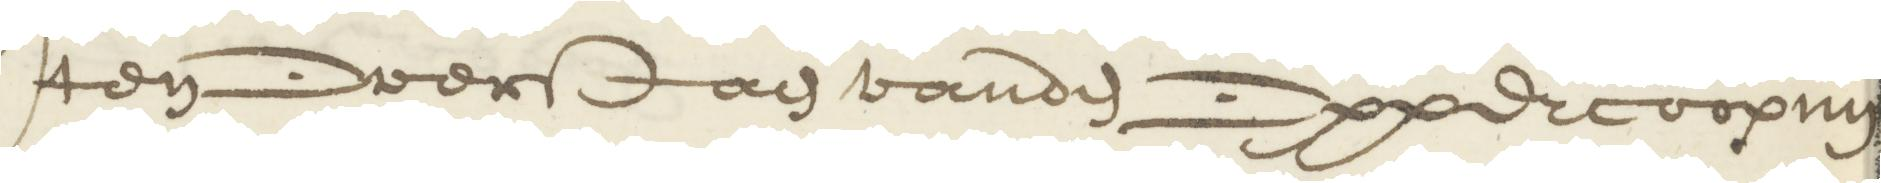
ten overstaen vanden Oppercoopmn
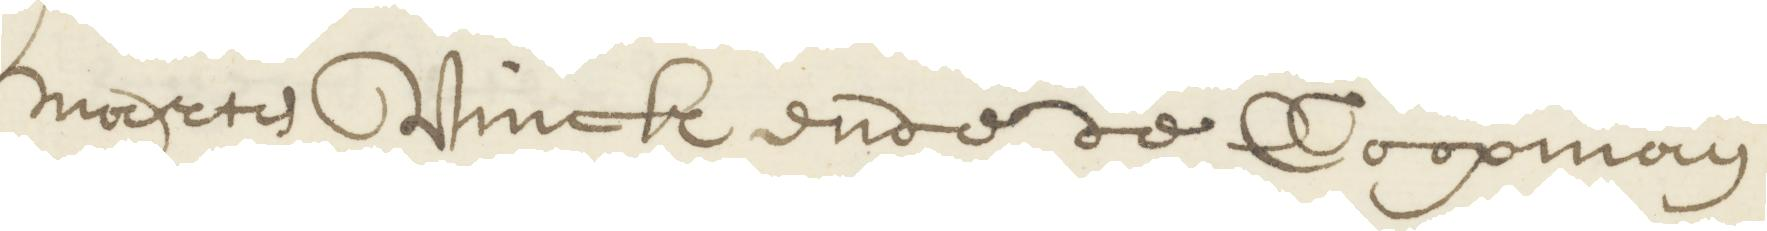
marten Vinck ende de Coopman
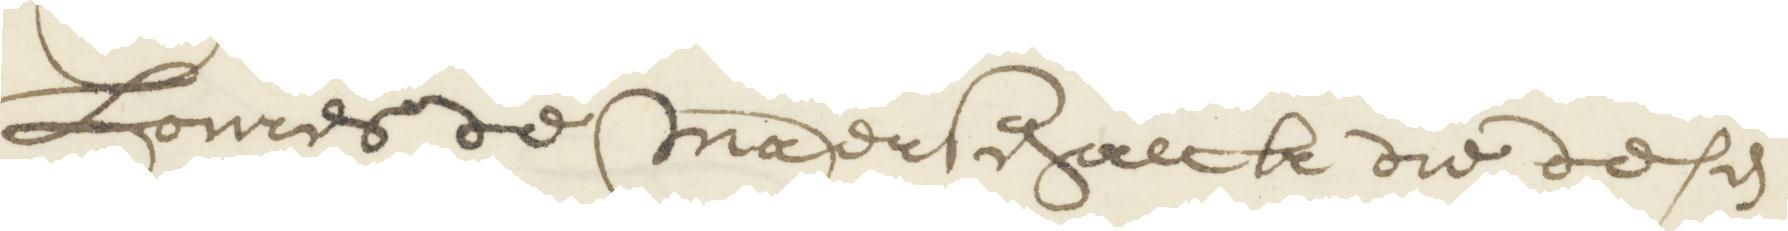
Loures de maerschalck die desen
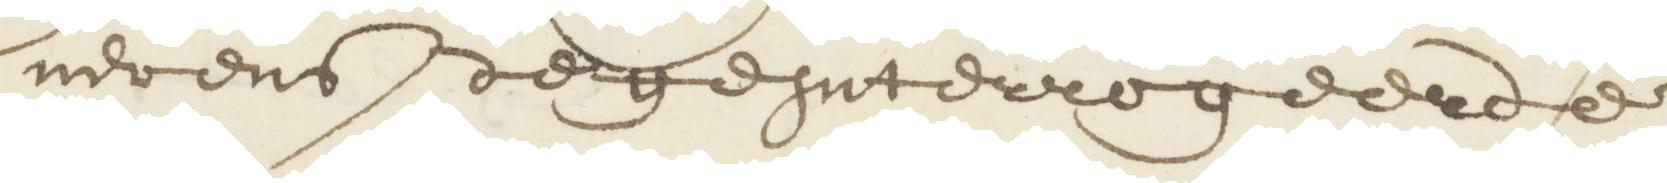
nevens de gejnterrogeerde
